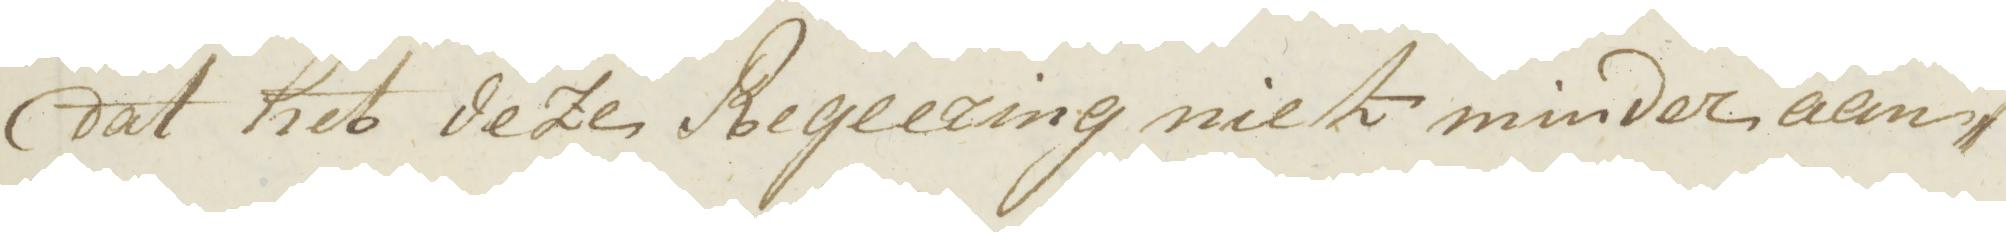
dat het deze Regeering niet minder aan„
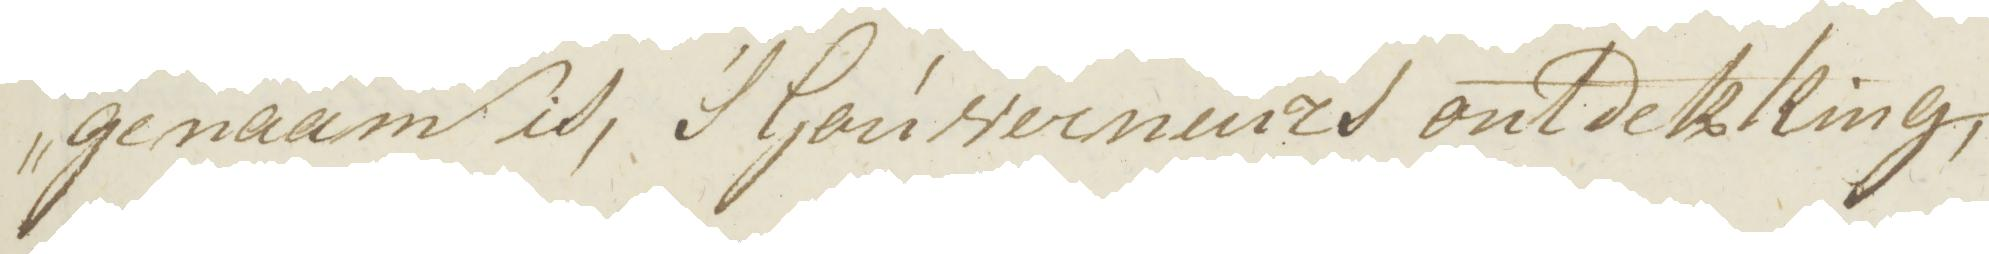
„genaam is, ’s Gouverneurs ontdekking,
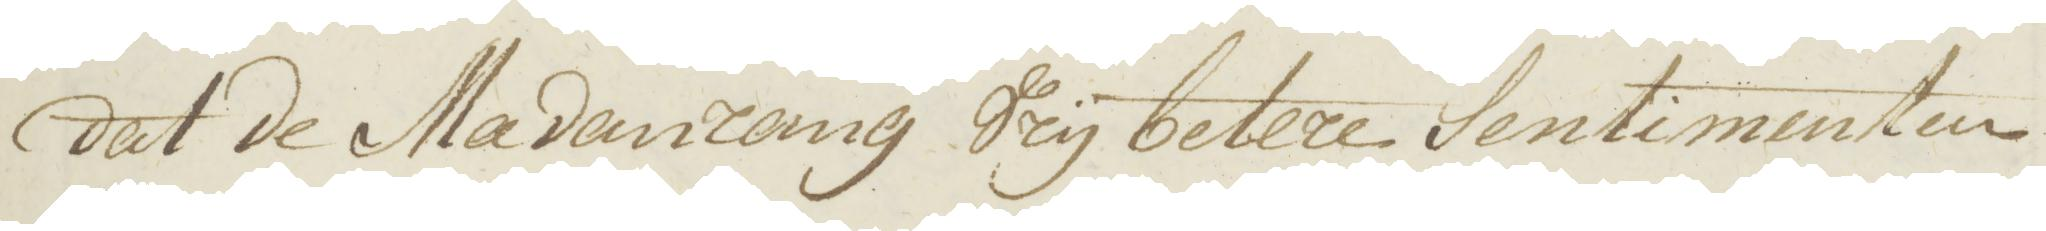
dat de Madanrang vrij betere sentimenten
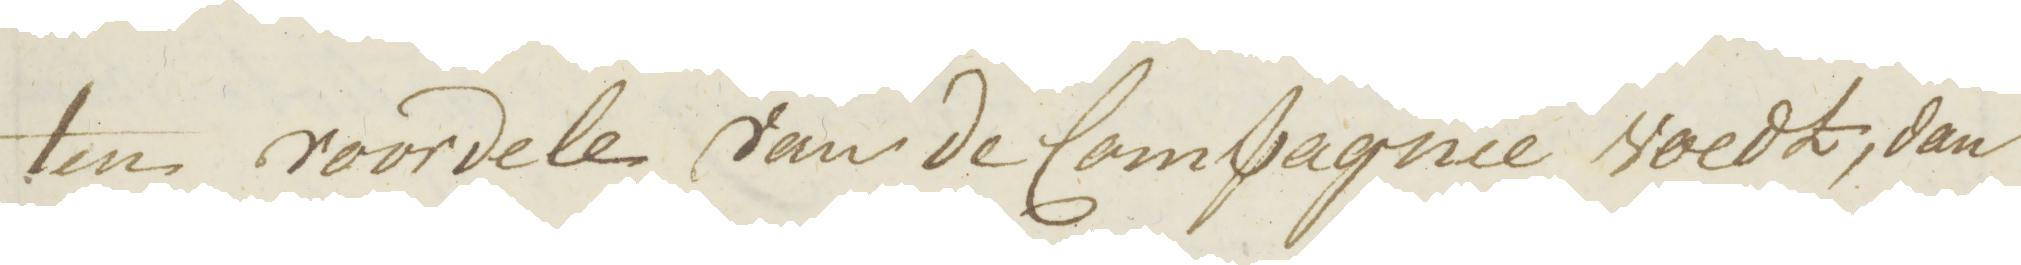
ten voordele van de compagnie voedt, dan
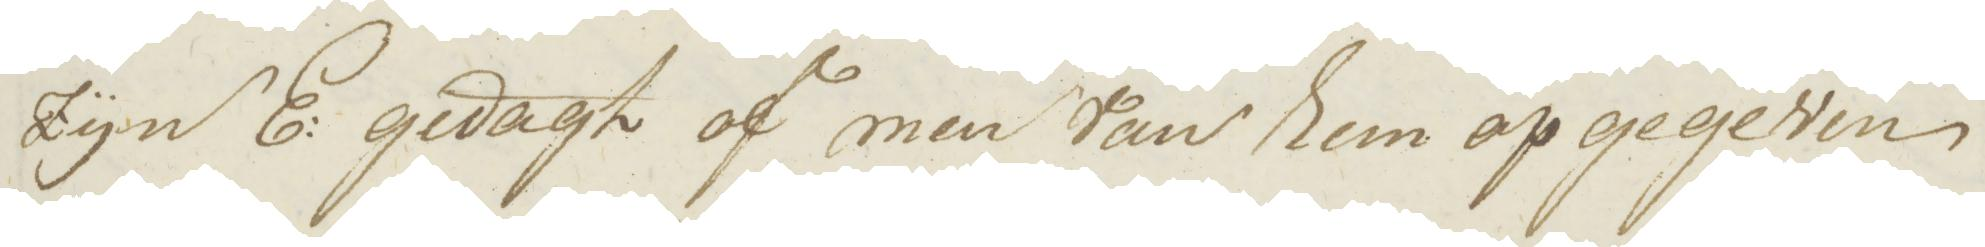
zijn E: gedagt of men van hem opgegeven
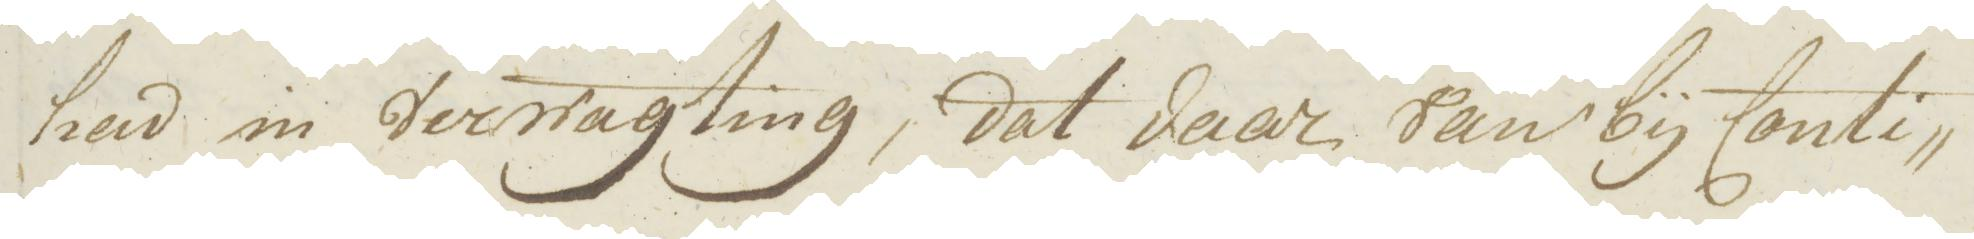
had in verwagting, dat daar van bij conti„
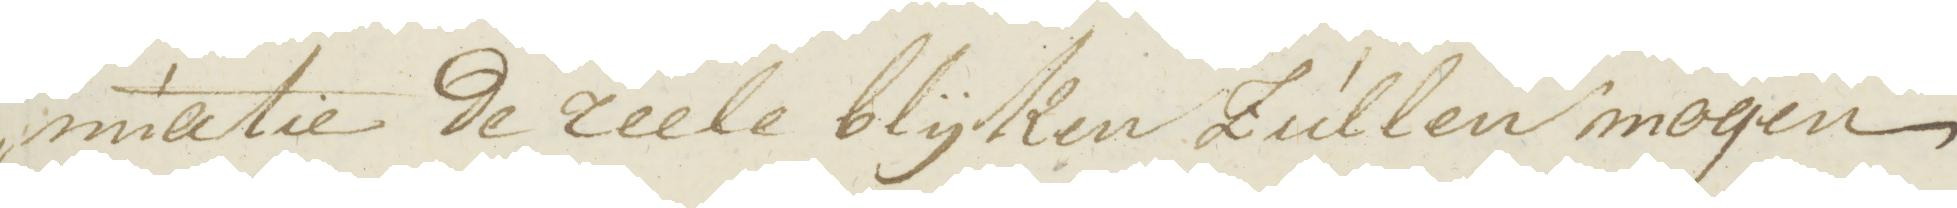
„nuatie de reele blijken zullen mogen
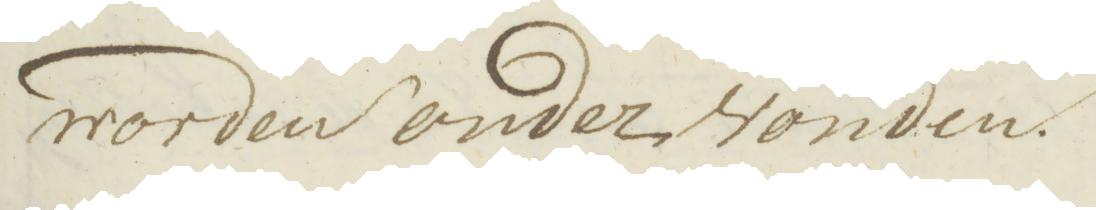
worden onder vonden.
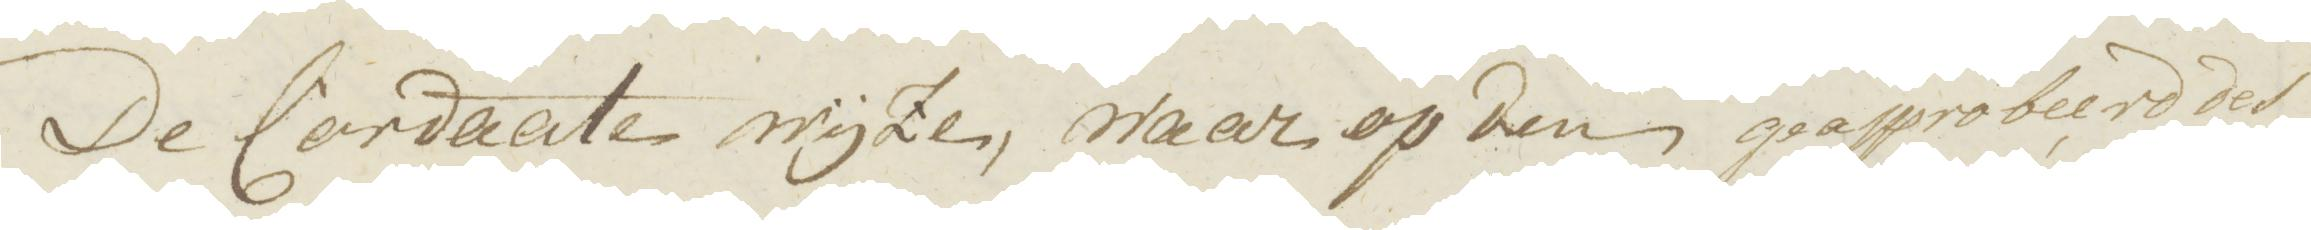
De cordaate wijze, waar op den geapprobeerd des
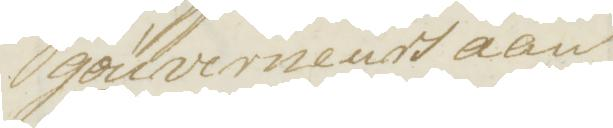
gouverneurs aan
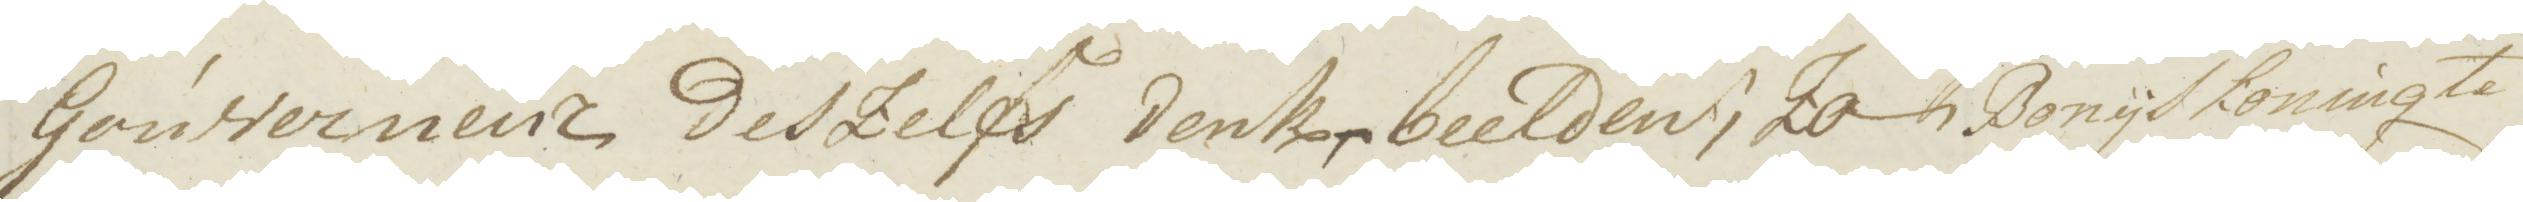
Gouverneur deszelfs denk-beelden, zo Bonijs koning te
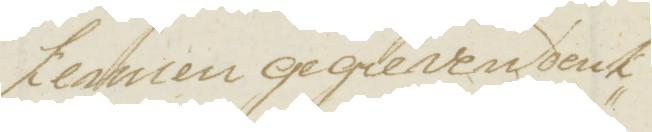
kennen gegeven denk„
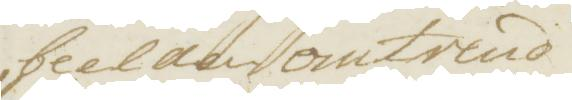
beelden omtrend
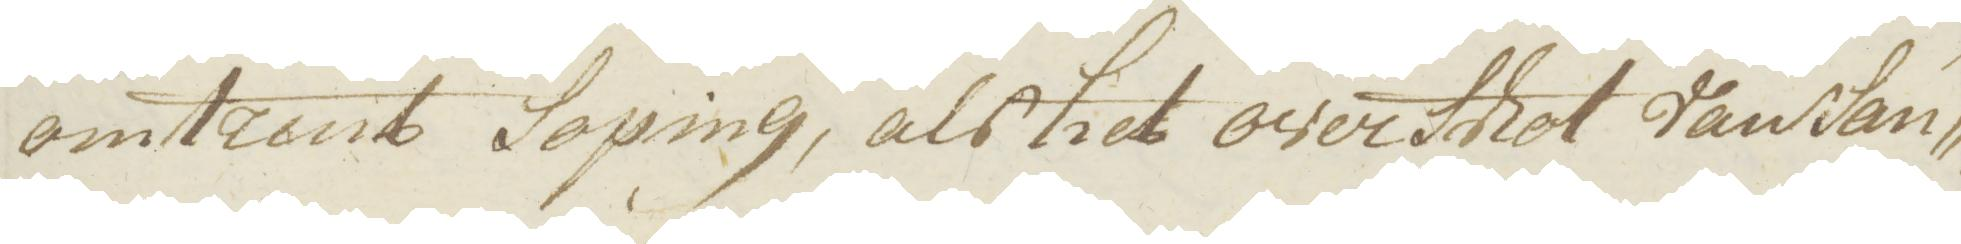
omtrent soping, als het overschot van San
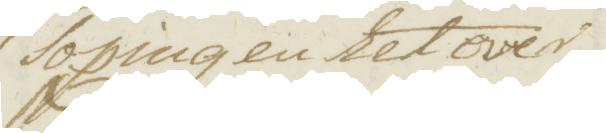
Soping en het over
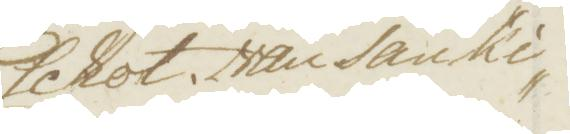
schot van sanki„
